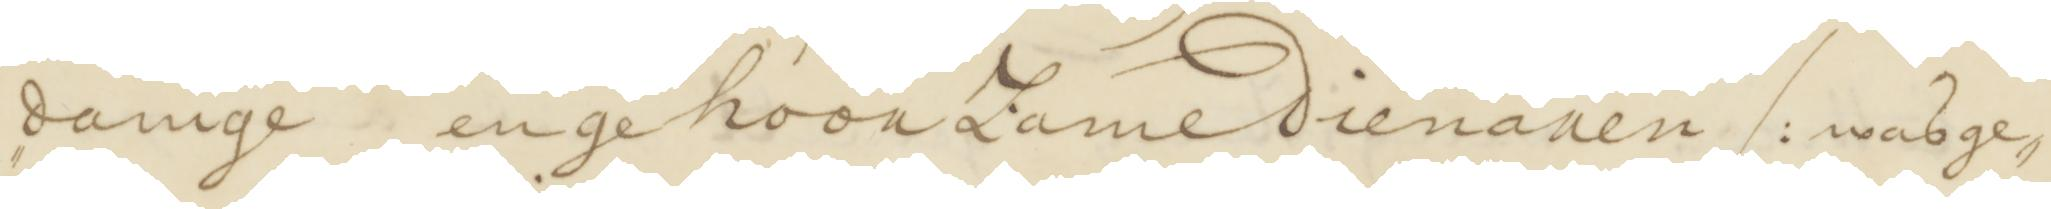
„danige en gehoorzame dienaren /: was ge„
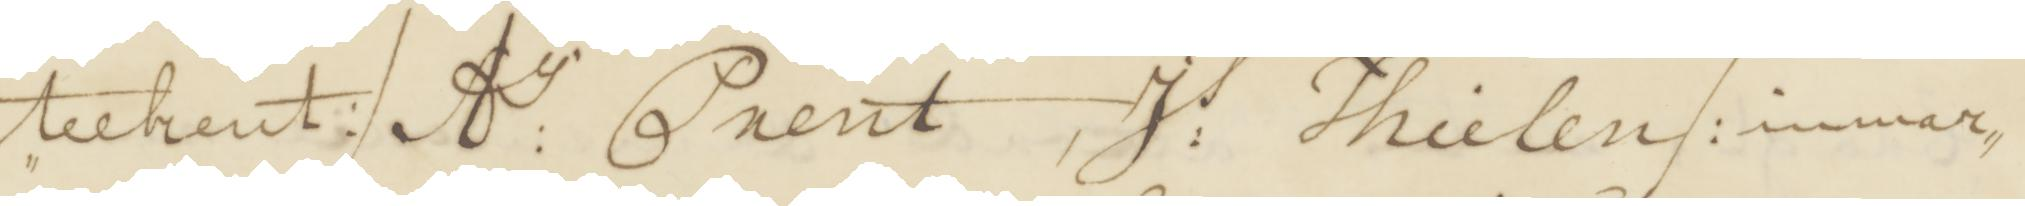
„teekent:/ A:ij Prent, J:s Thielen /:in mar„
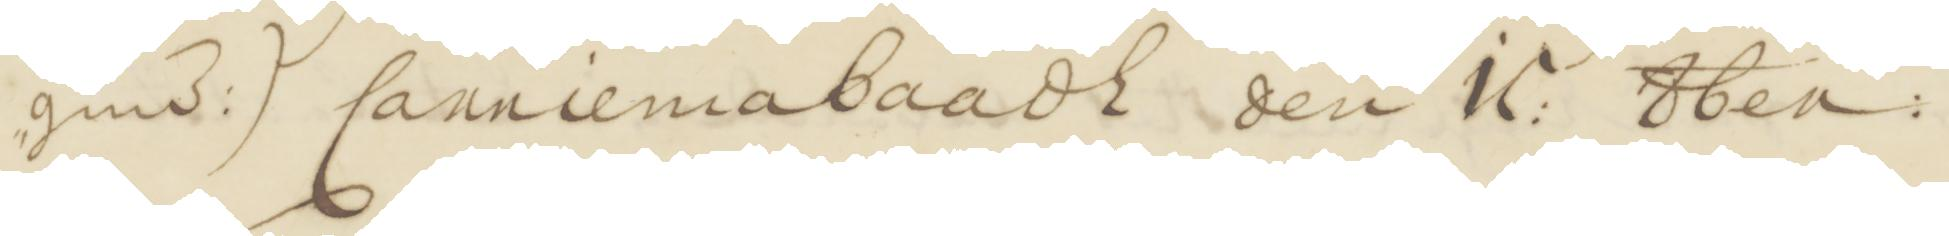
„gine:/ Carriemabaadh den 15:' 8ber:
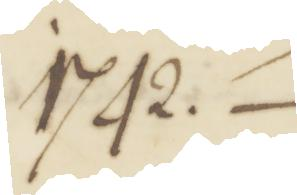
1742. —
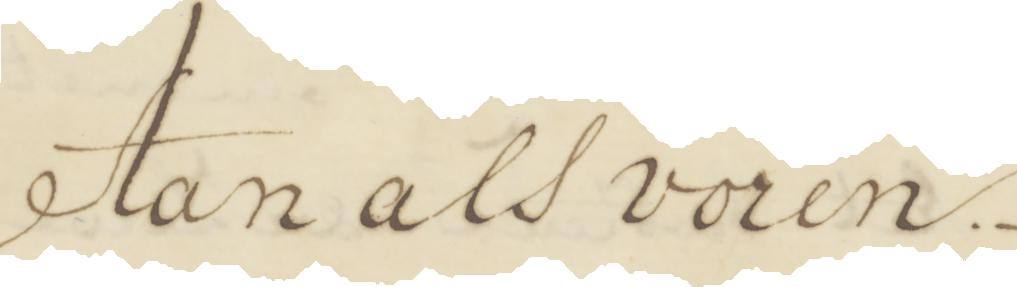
Aan als voren. —
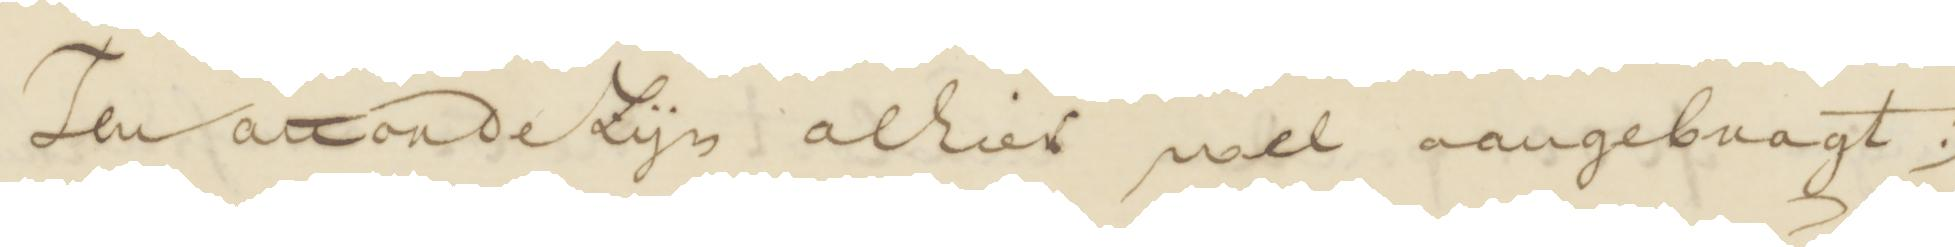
Ten accorde Zijn alhier wel aangebragt:)
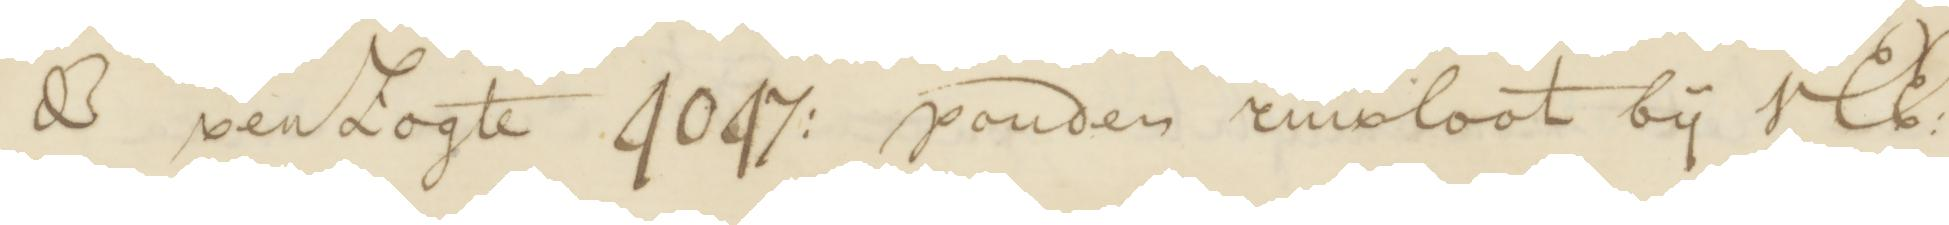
de verzogte 4047: ponden ruw loot bij vEE:
